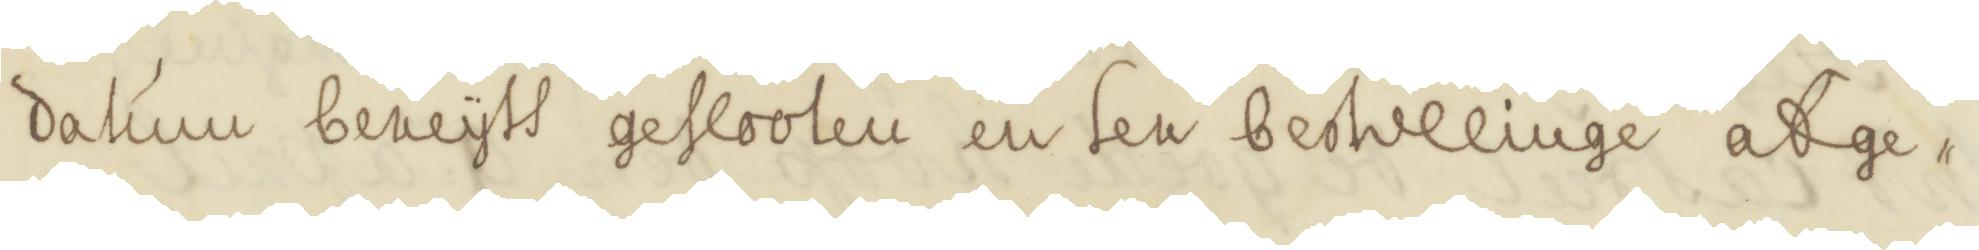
datum bereijts geslooten en ter bestellinge afge„
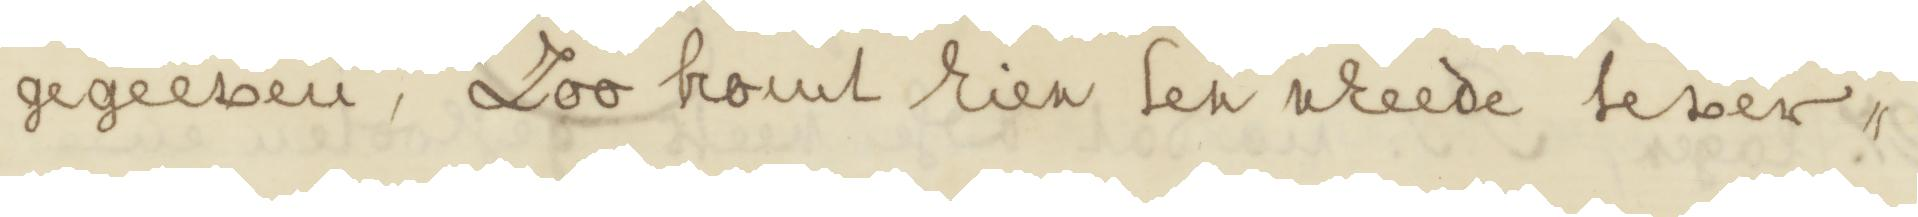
gegeeven, zoo komt hier ter rheede te ver„
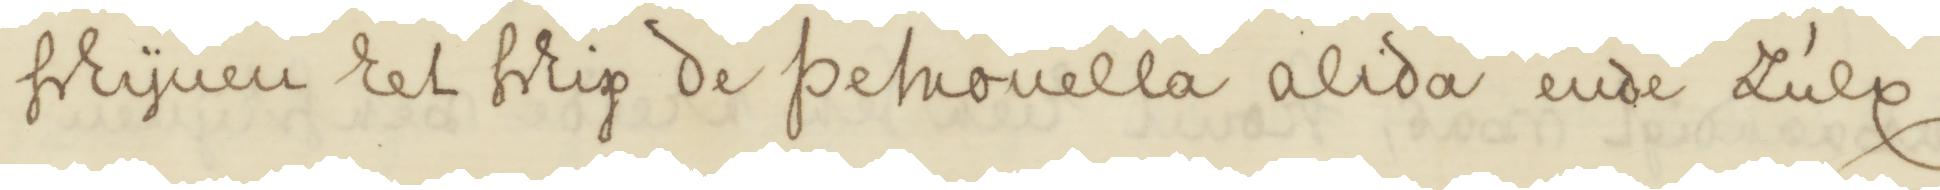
schijnen het schip de petronella alida ende zulx
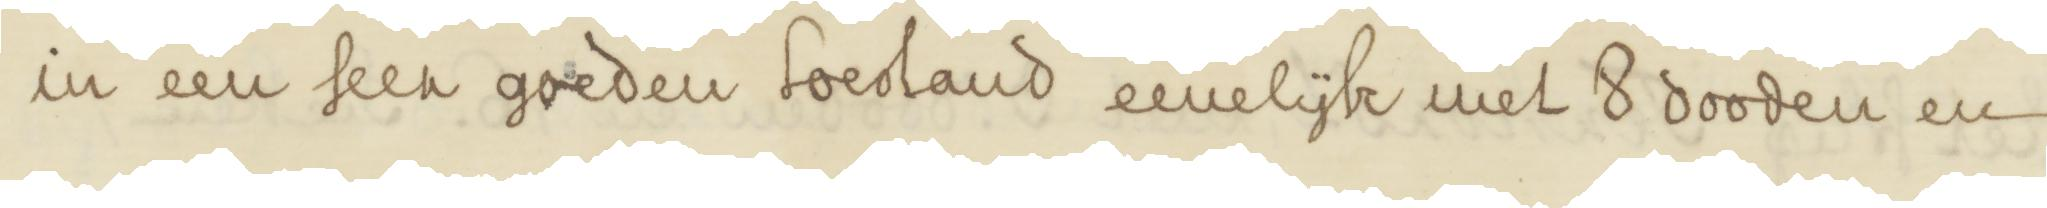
in een seer goeden toestand eenelijk met 8 dooden en
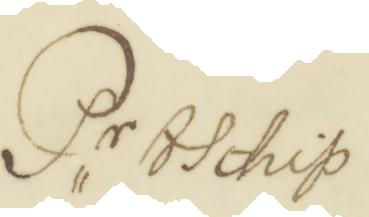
P„r tschip
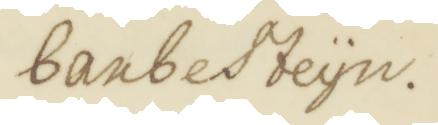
barbesteijn.
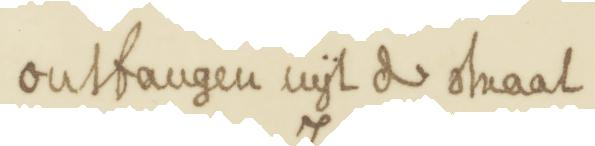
ontfangen uijt de straat
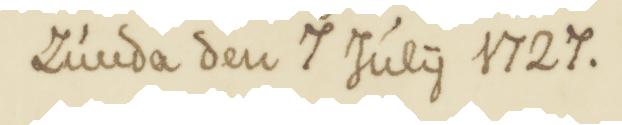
zunda den 7 Julij 1727.
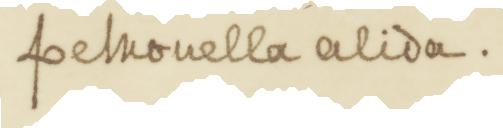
petronella alida.
